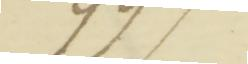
997
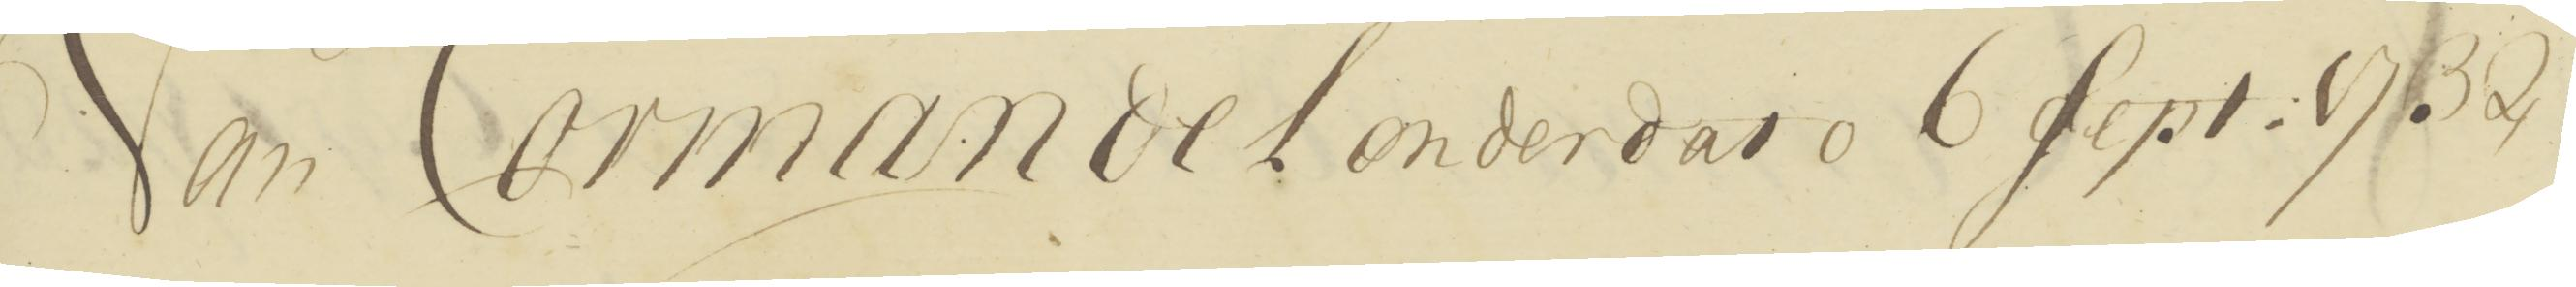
Van Cormandel onder dato 6 sept: 1732
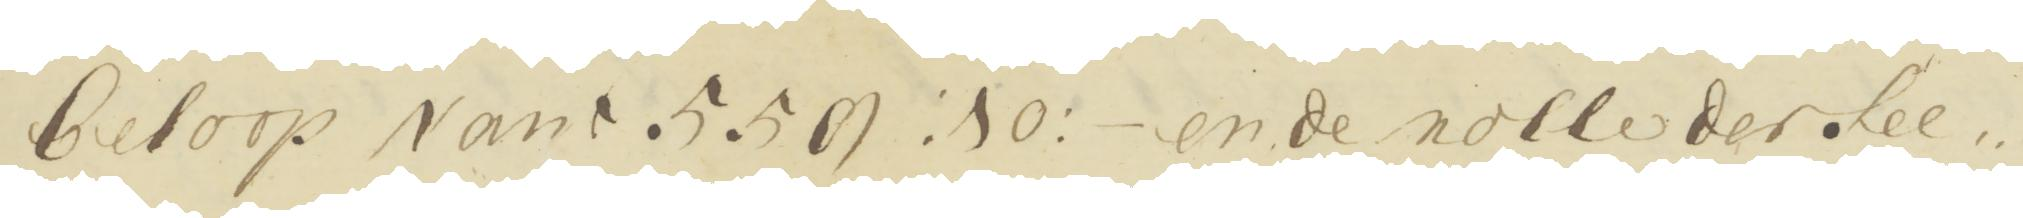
beloop van ƒ 558 :10:— en de rolle der see„
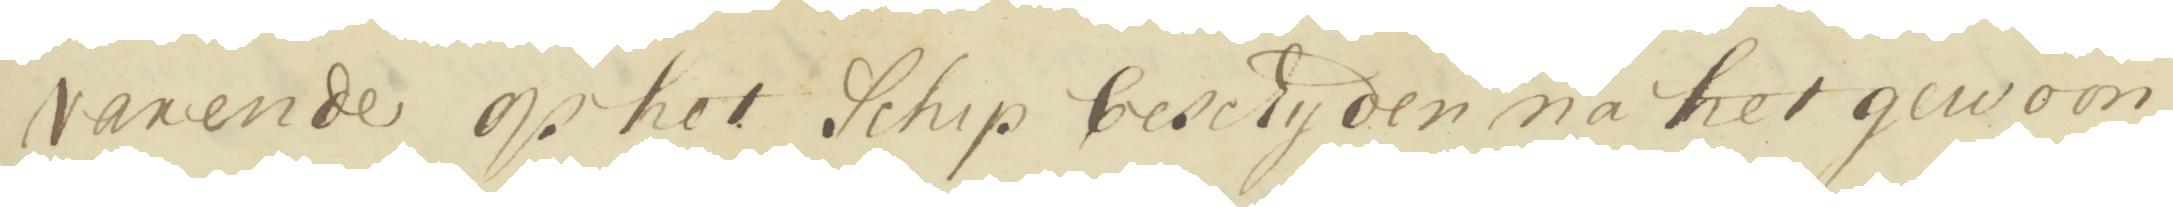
varende op het schip beschyden na het gewoon
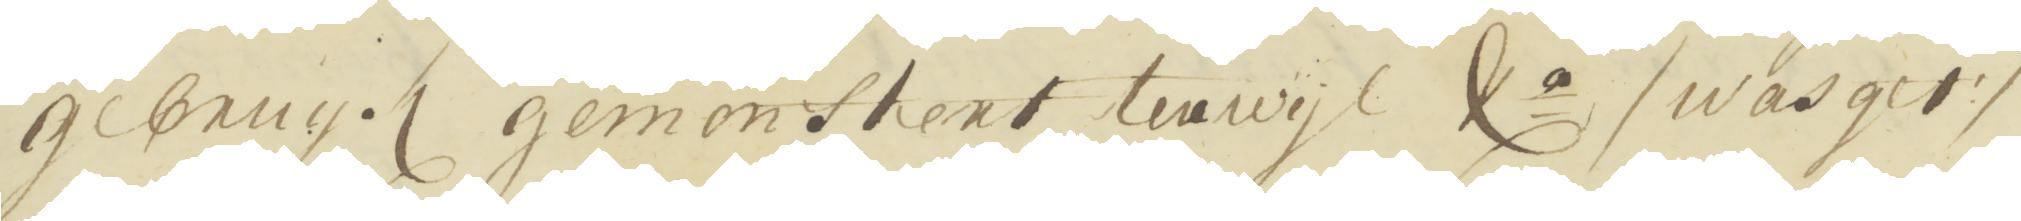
gebruijk gemonstert terwijl &=a /was get:/
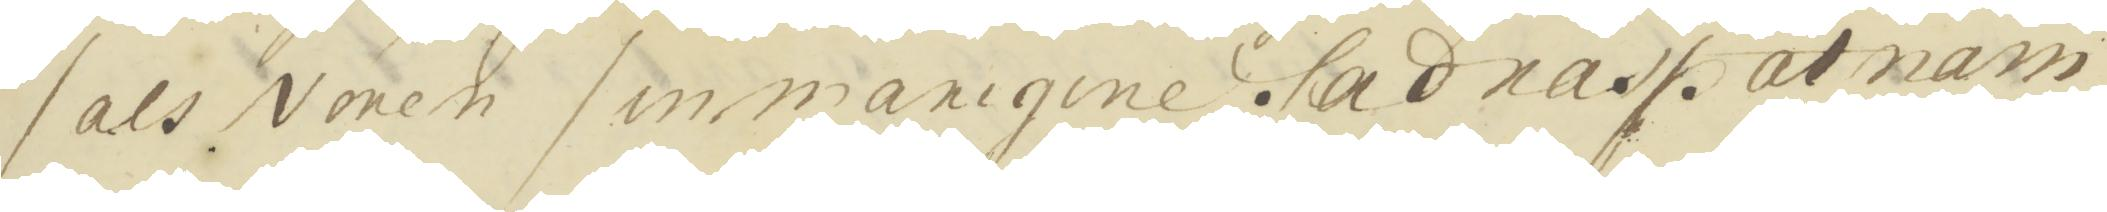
/als Voren/ in marigine Sadraspatnam
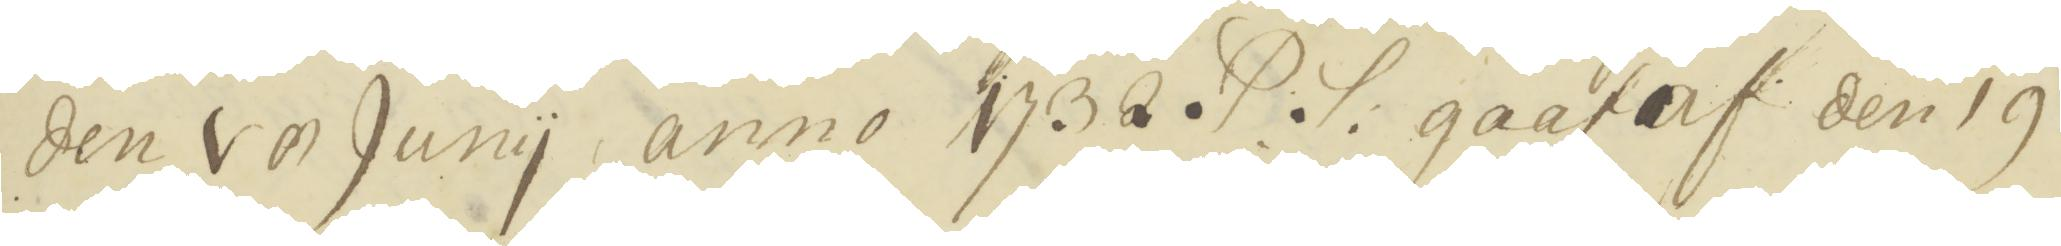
den 18 Junij anno 1732 P: S: gaat af den 19
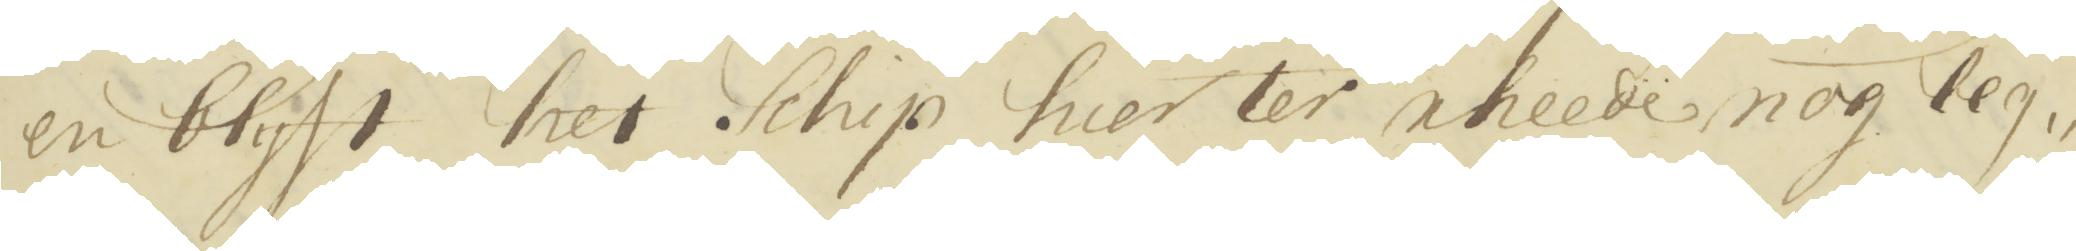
en blijft het schip hier ter rheede nog leg„
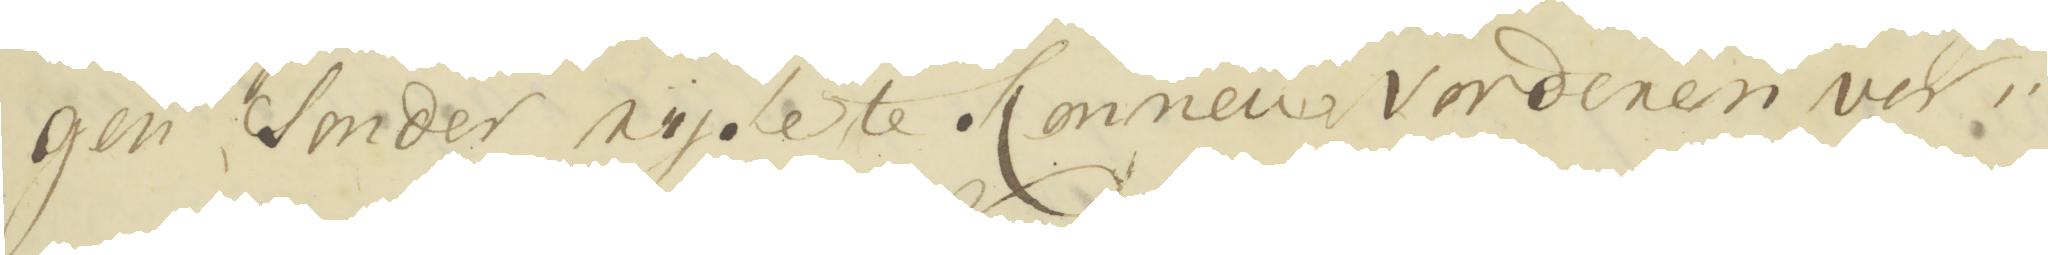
gen, sonder rijse te konnen vorderen ver„
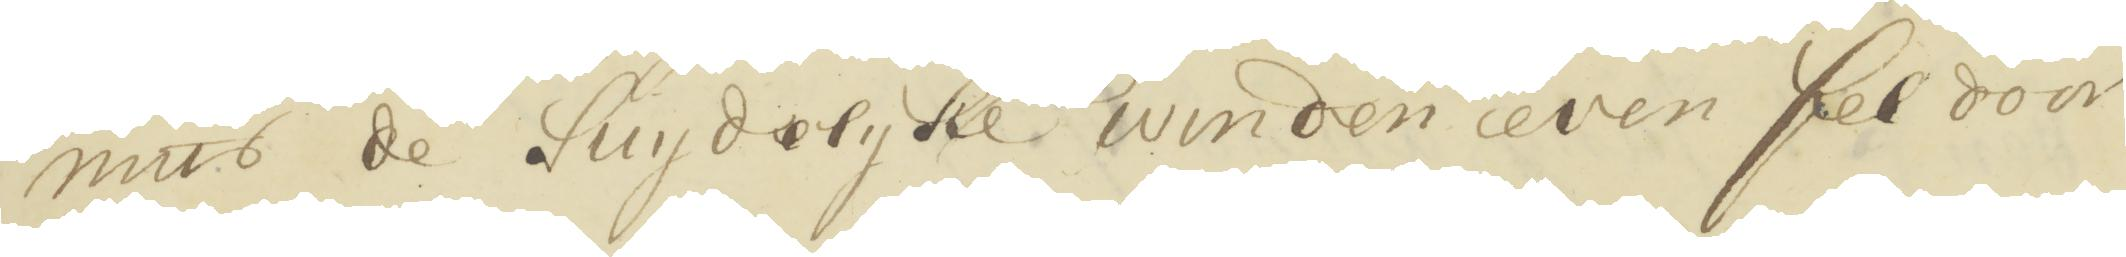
mits de Suydelyke winden eeven sel door
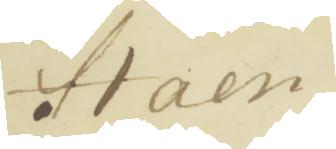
staen
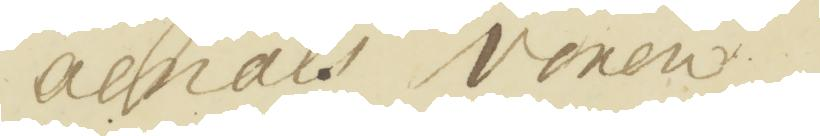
aen als voren:
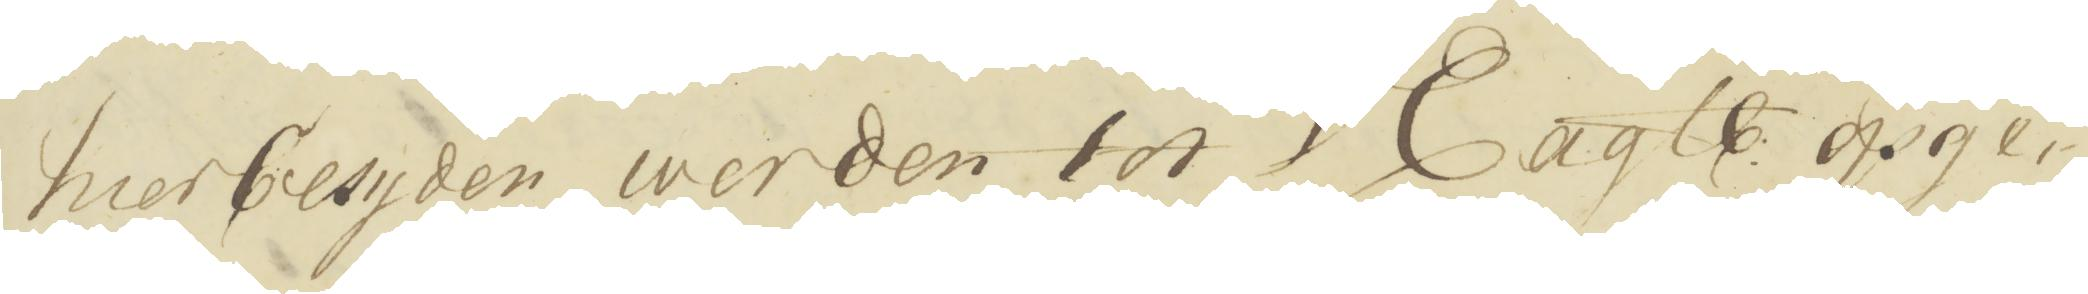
hier besyden werden tot VE agtb: opge„
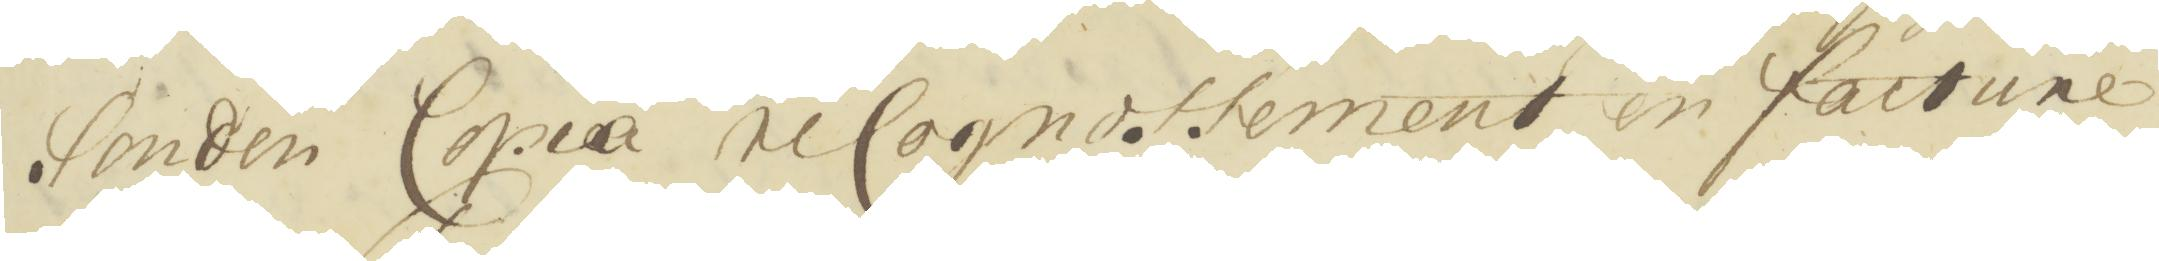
sonden copia recognossement en facture
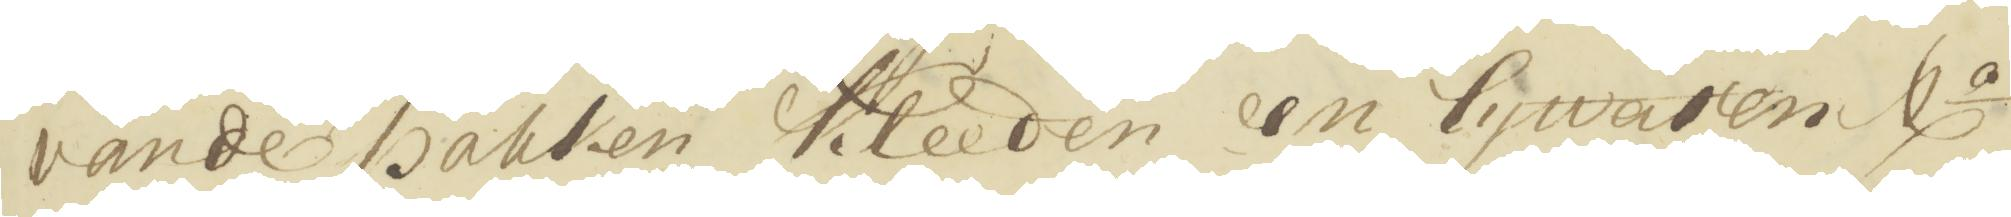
vande pakken kleeden en lywaten &=a
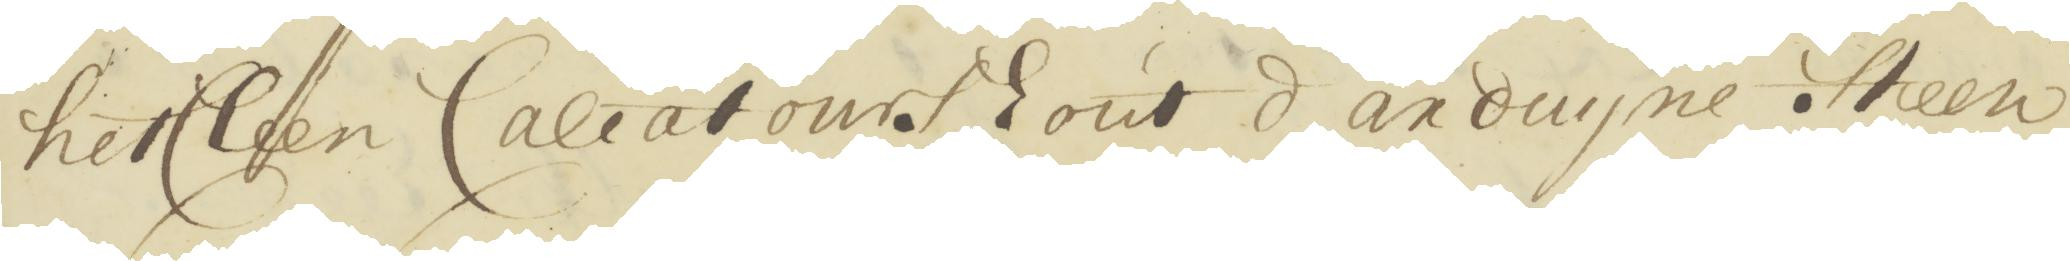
het Cleen Caliatours hout d arduyne steen
